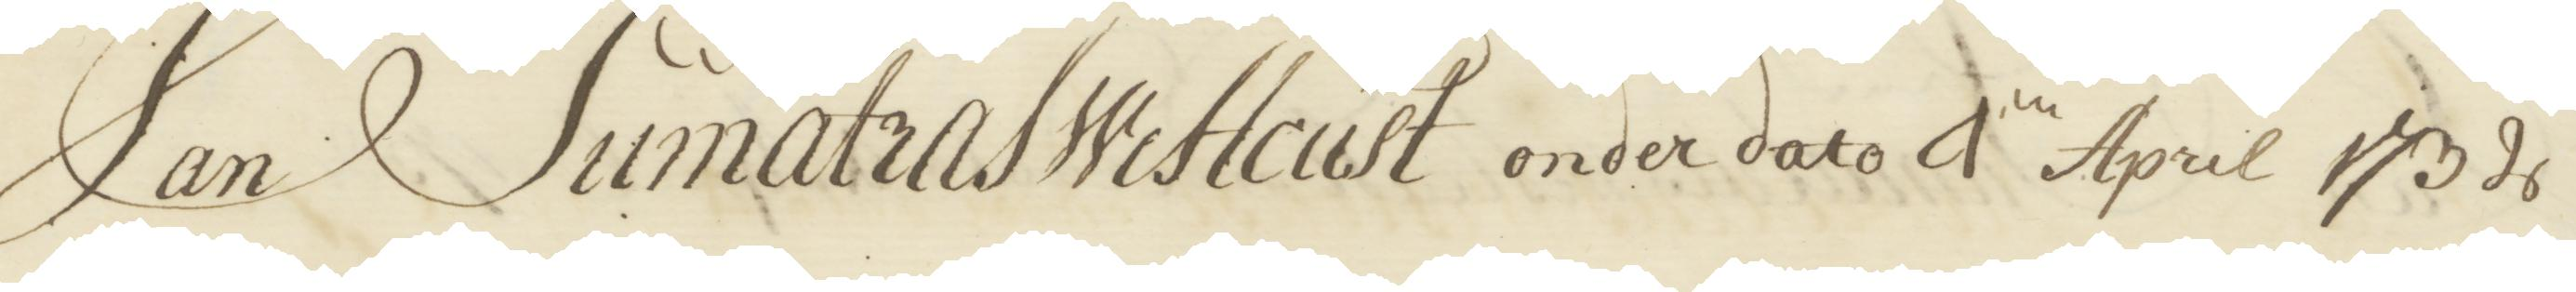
Van Sumatras Westcust onder dato 4:en April 1732
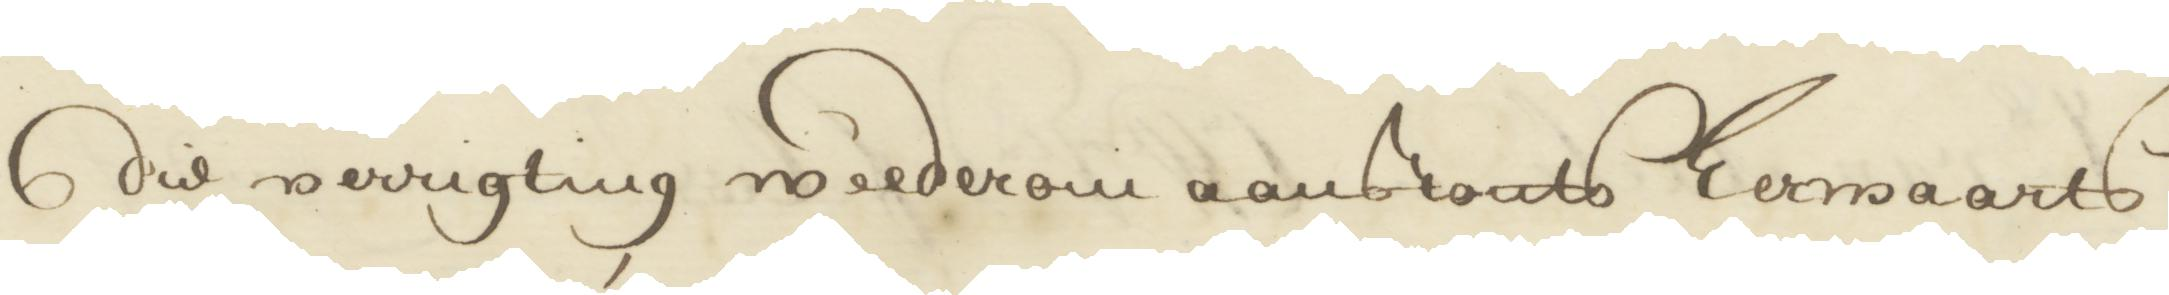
die verrigting weederom aanstonts herwaarts
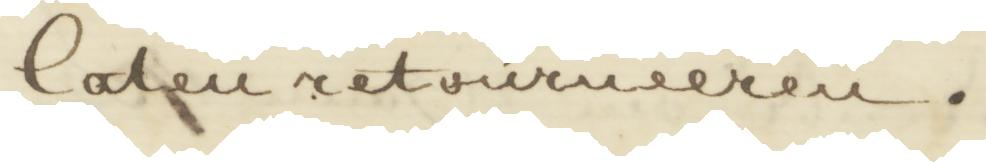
laten retourneeren.
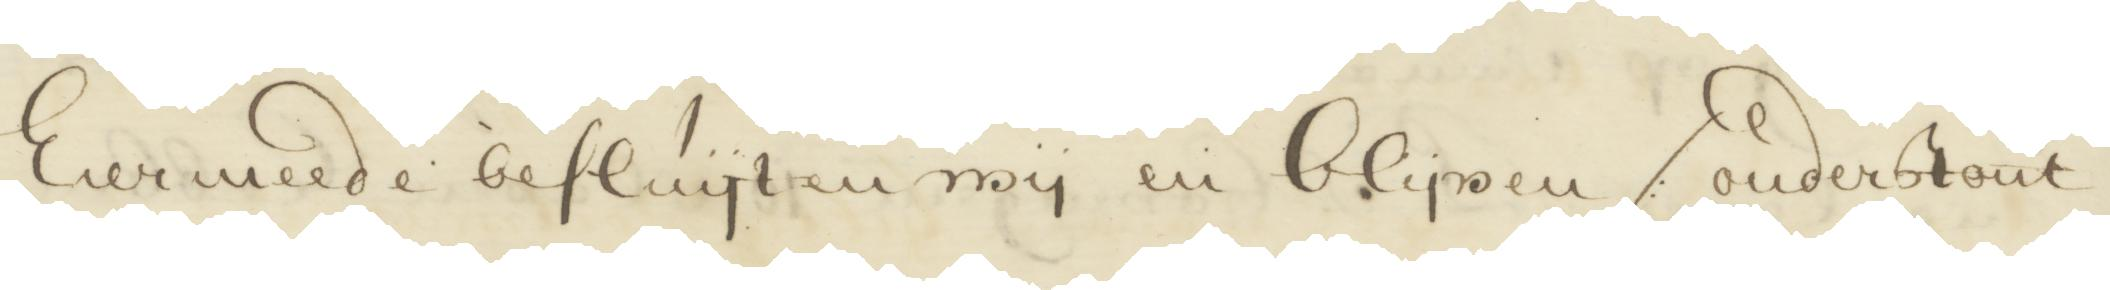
hier meede besluijten wij en blijven /:onderstont
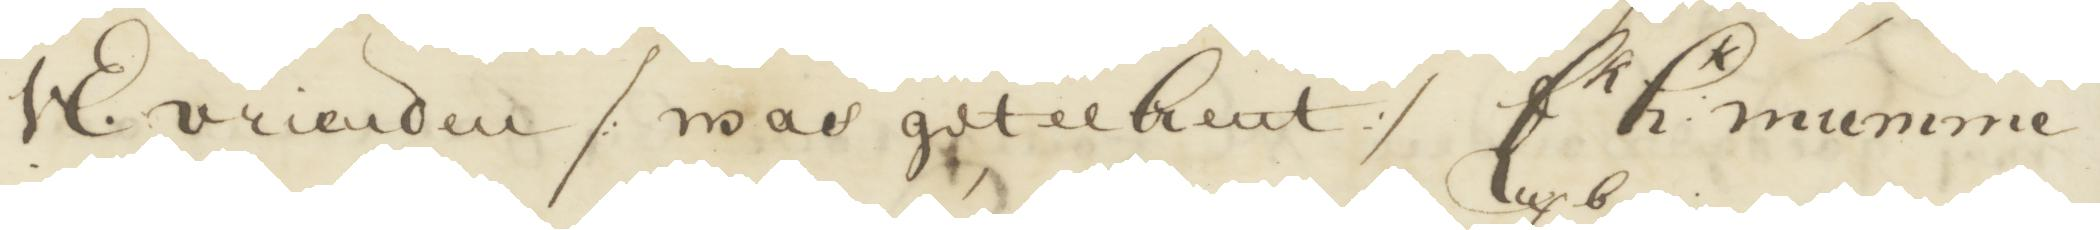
uE. vrienden /:was geteekent:/ fk h:k mumme
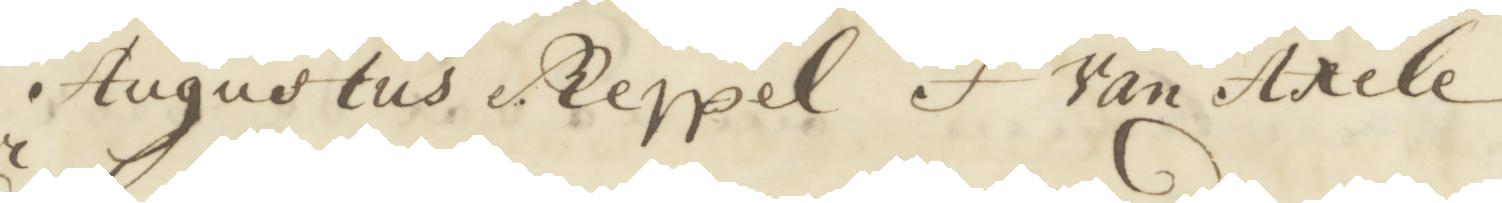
Augustus Reppel Jb van Axele
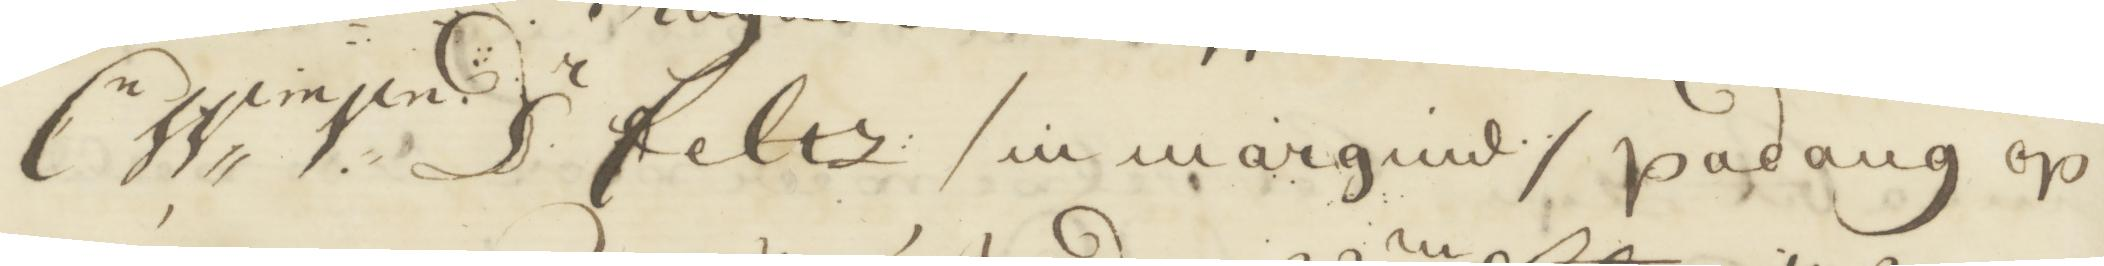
Cn W„in V„n. Dr feltz: /in margine/ padang op
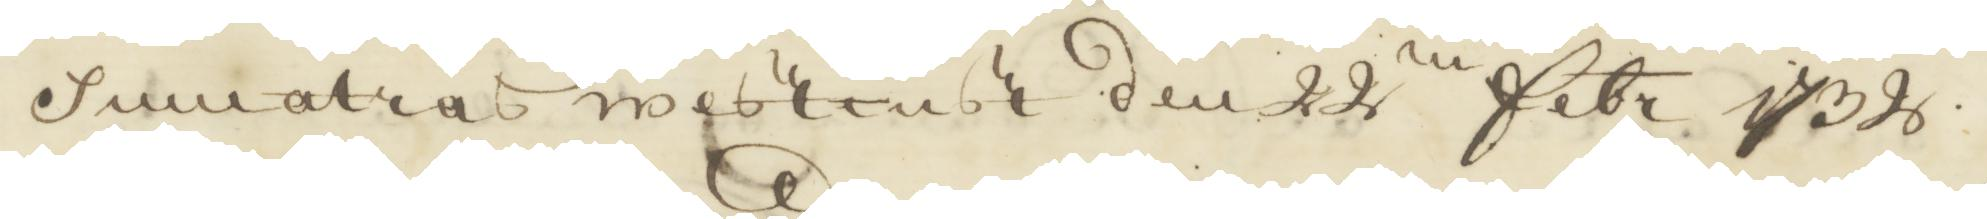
Sumatras westcust den 22en febr. 1732.
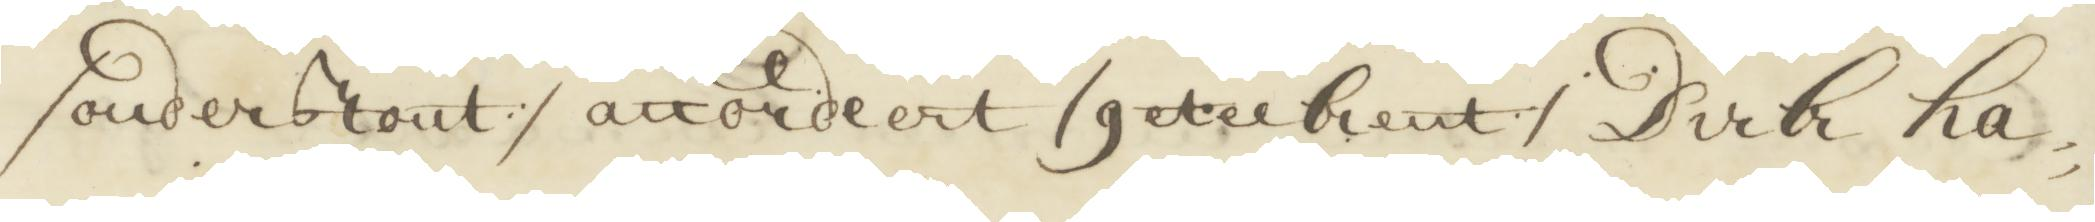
/onderstont:/ accordeert /geteekent/ Dirk ha„
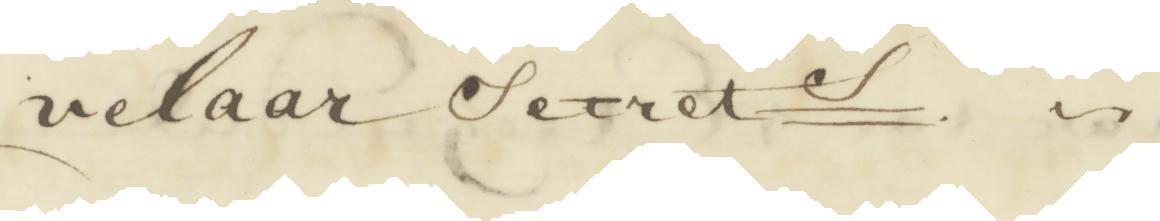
velaar secret=s. -
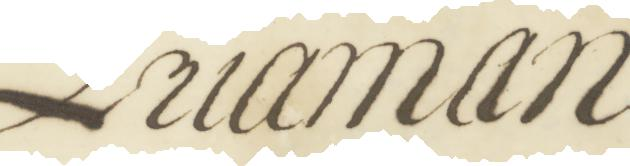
Priaman
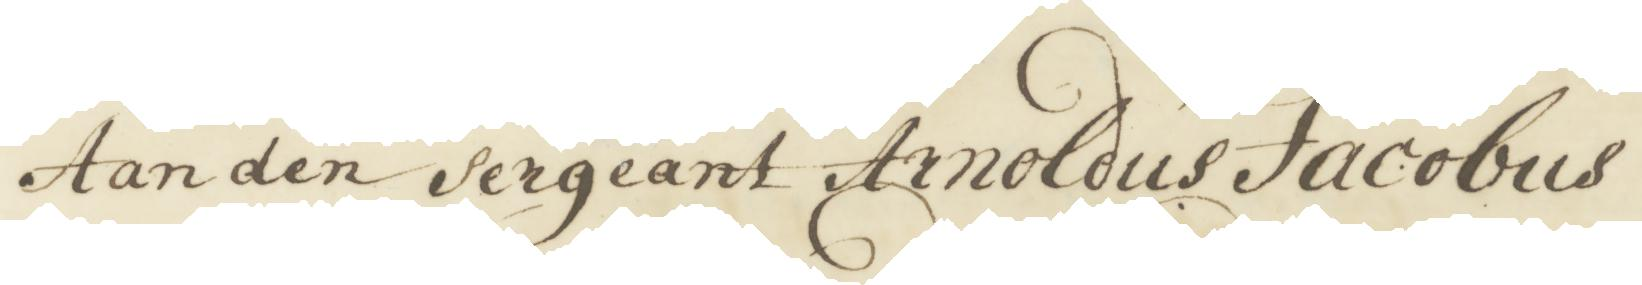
Aan den sergeant Arnoldus Jacobus
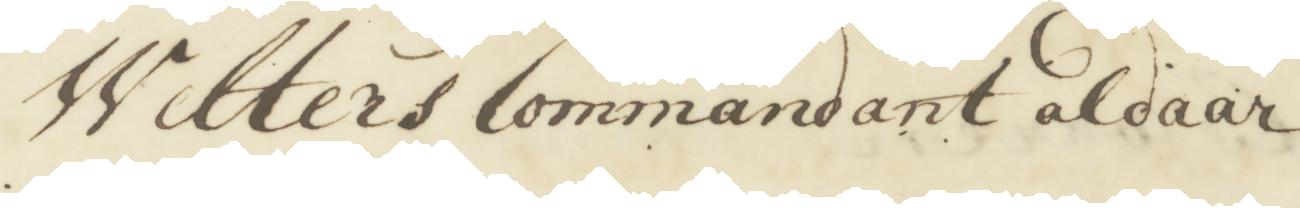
Wilters Commandant aldaar
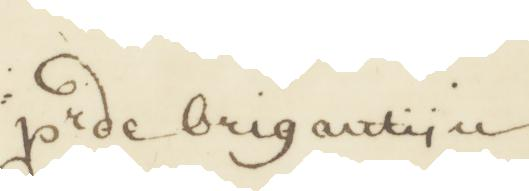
pr de brigantijn
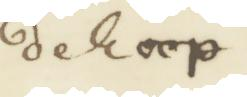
de hoop
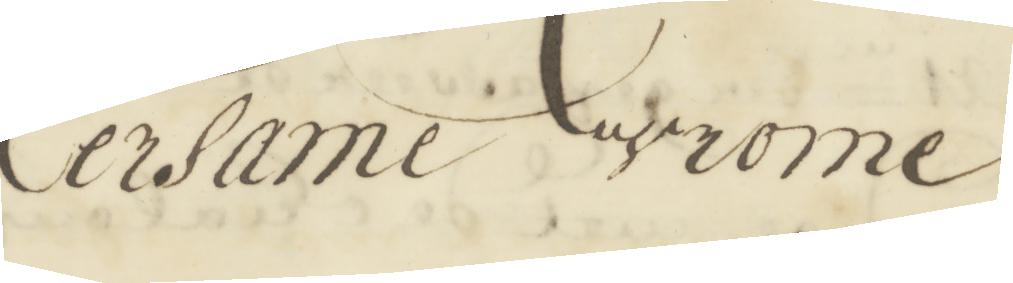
Eersame vrome
